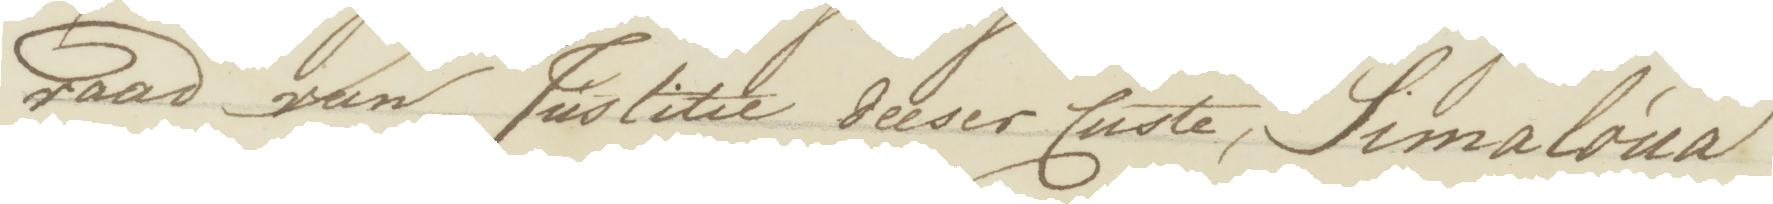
raad van Justitie deeser Custe, Simaloua
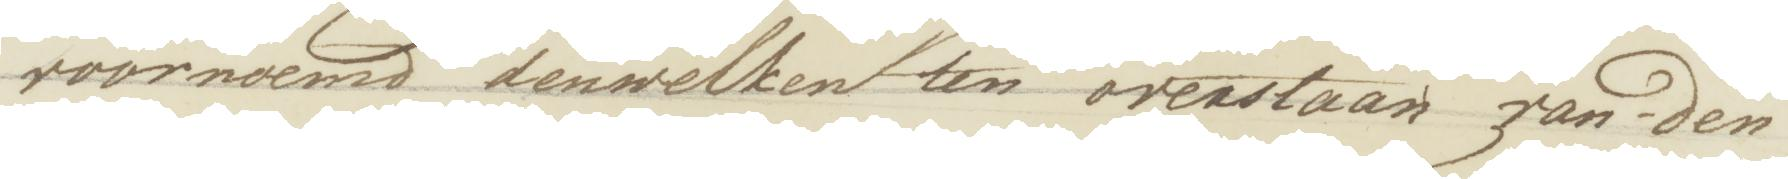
voornoemd denwelken ten overstaan van -den
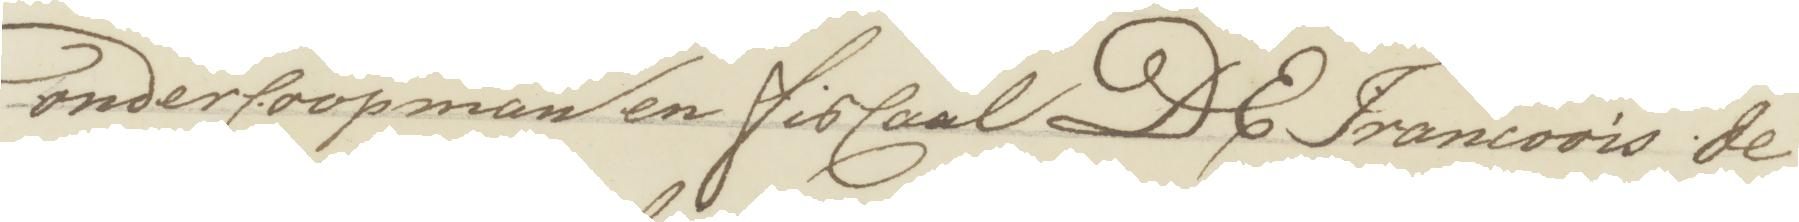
ondercoopman en fiscaal DE Francoois de
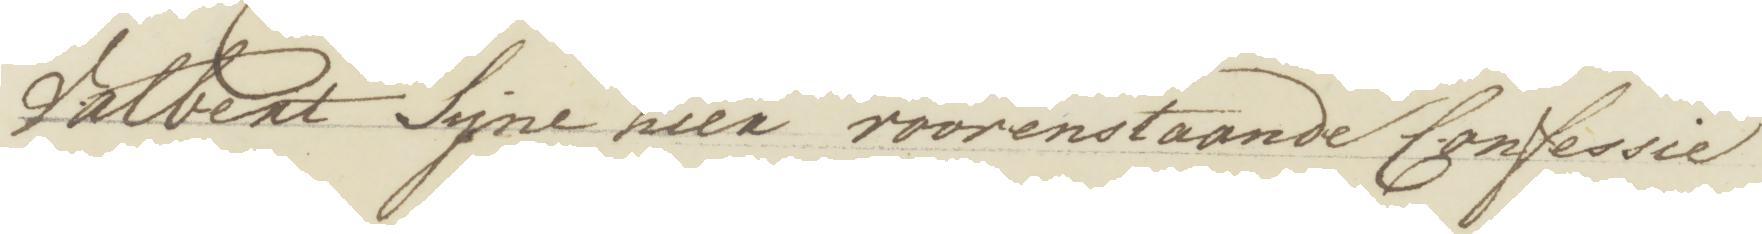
Valbert sijne hier voorenstaande confessie
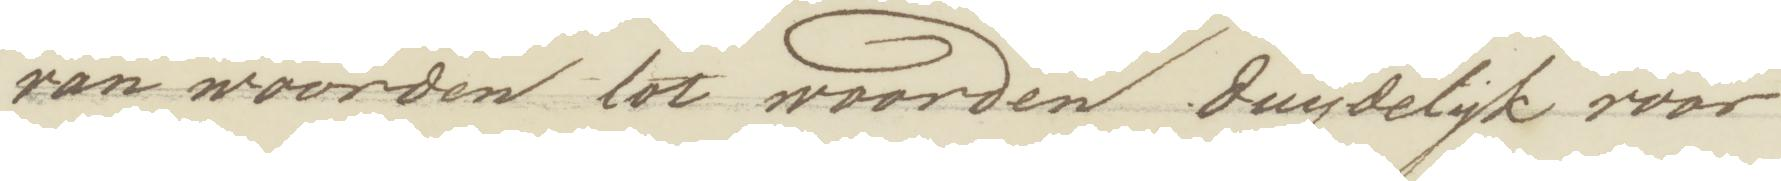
van woorden tot woorden duijdelijk voor
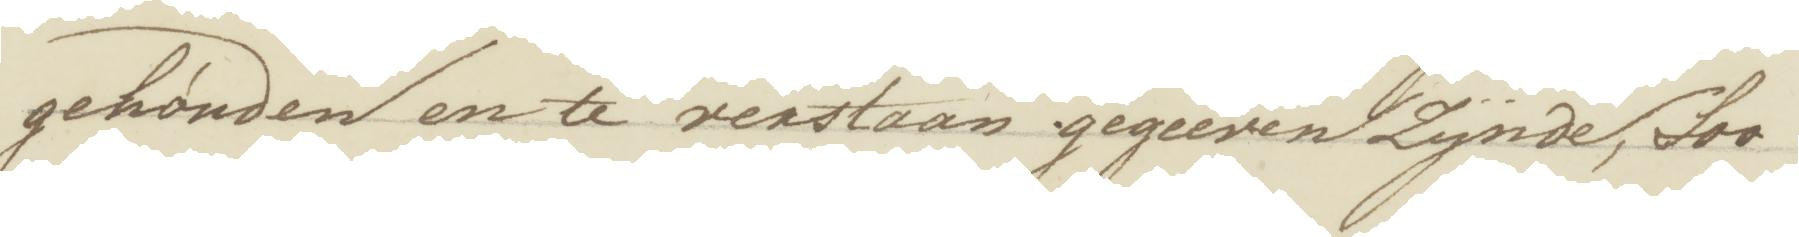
gehouden en te verstaan gegeeven zijnde, soo
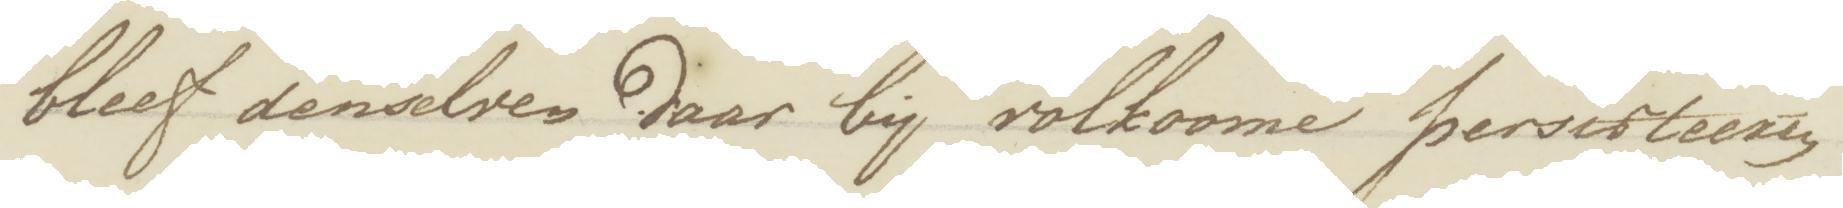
bleef denselven daar bij volkoome persisteeren
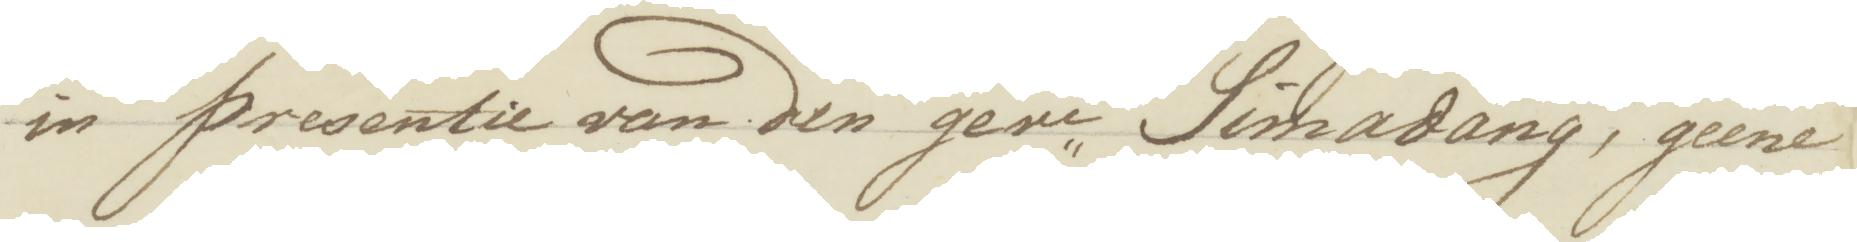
in presentie van den gev„e Simadang, geene
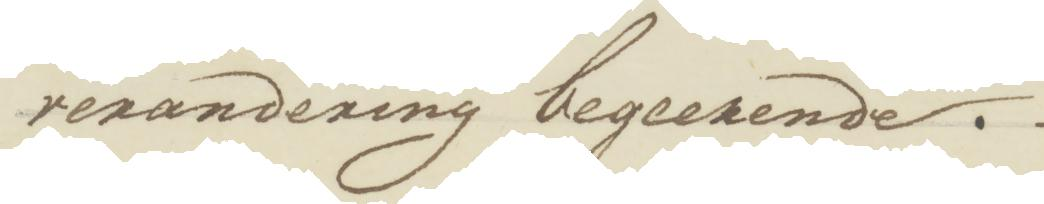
verandering begeerende.
